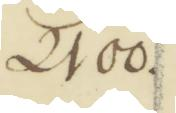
2100.
